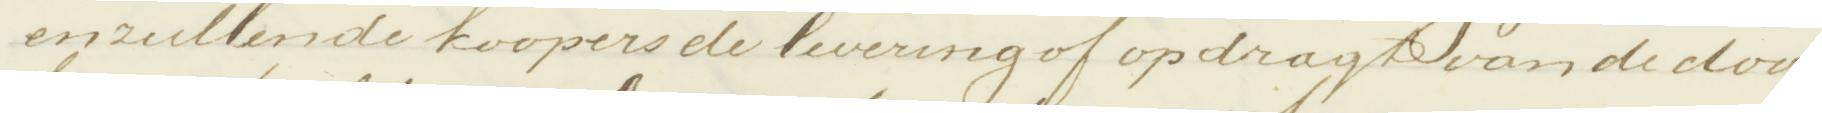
en zullen de koopers de levering of opdragt van de door
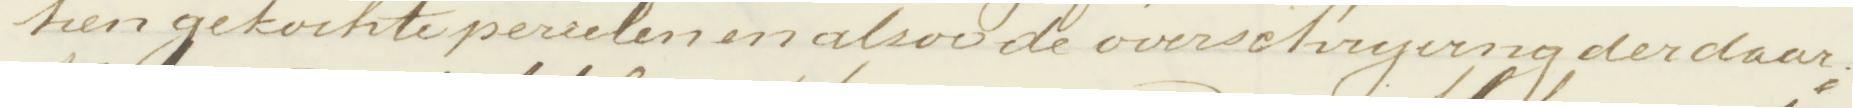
hen gekochte percelen en alzoo de overschryving der daar„
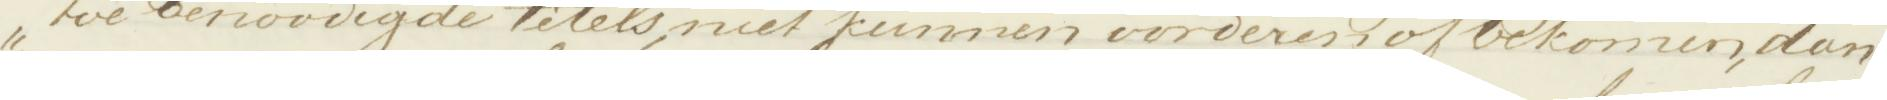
toe benoodigde titels, niet kunnen vorderen of bekomen, dan
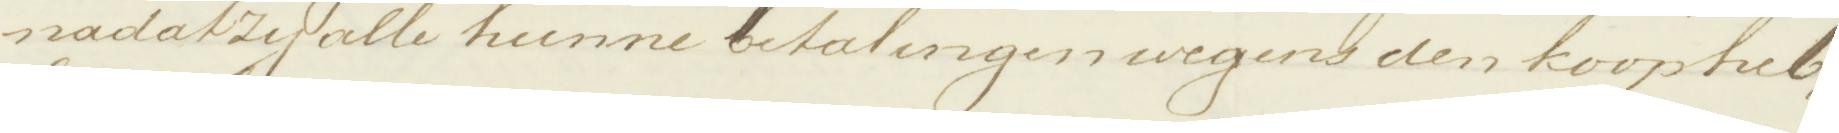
nadat zy alle hunne betalingen wegens den koop heb„
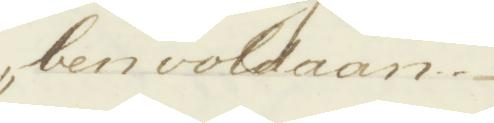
„ben voldaan.
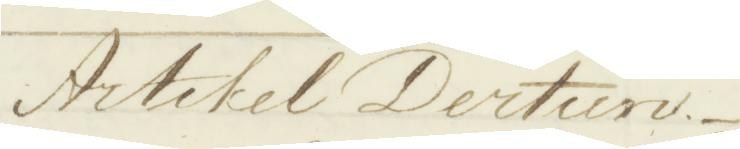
Artikel Dertien.—
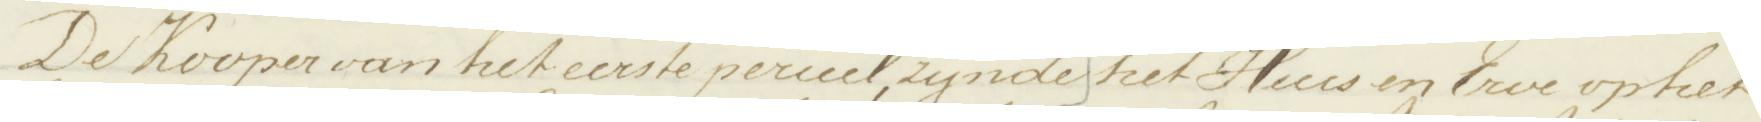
De Kooper van het eerste perceel, zynde/ het Huis en Erve op het
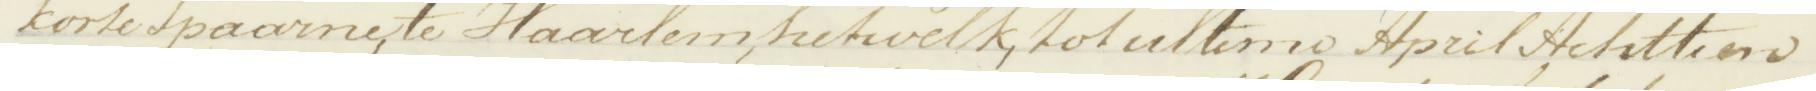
korte Spaarne te Haarlem, hetwelk, tot ultimo April Achttien
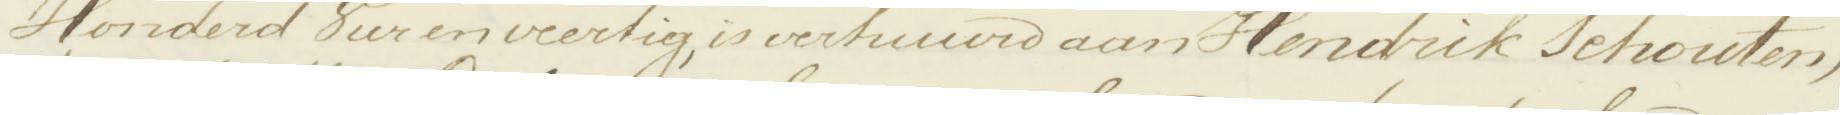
Honderd Vier en veertig, is verhuurd aan Hendrik Schouten,
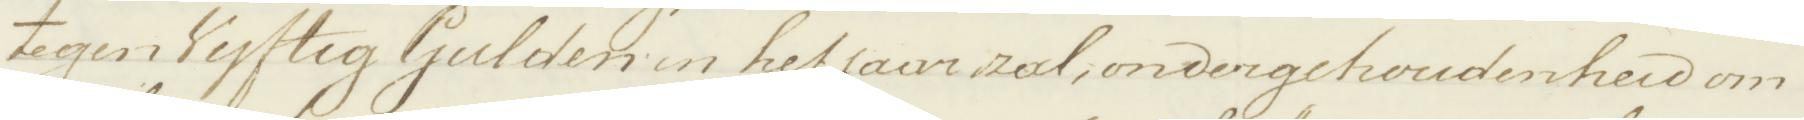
tegen Vyftig Gulden in het jaar zal, onder gehoudenheid om
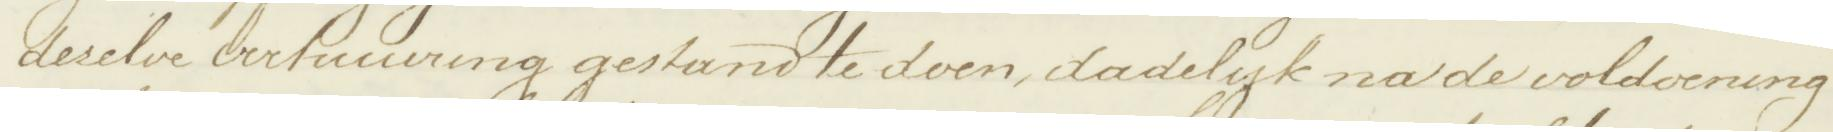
dezelve verhuuring gestand te doen, dadelyk na de voldoening
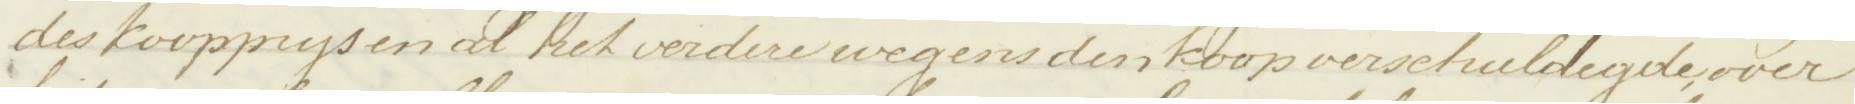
des koopprys en al het verdere wegens den koop verschuldigde, over
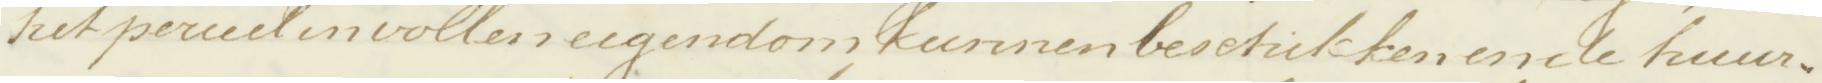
het perceel in vollen eigendom kunnen beschikken en de huur„
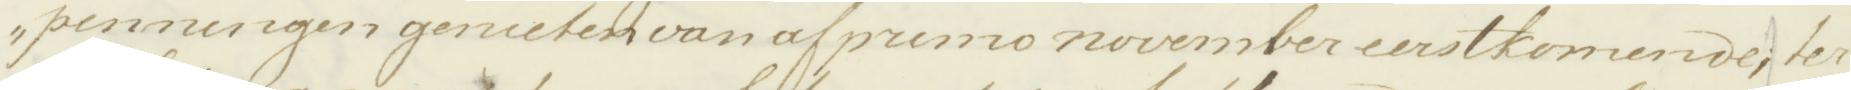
„penningen genieten van af primo november eerstkomende; / ter
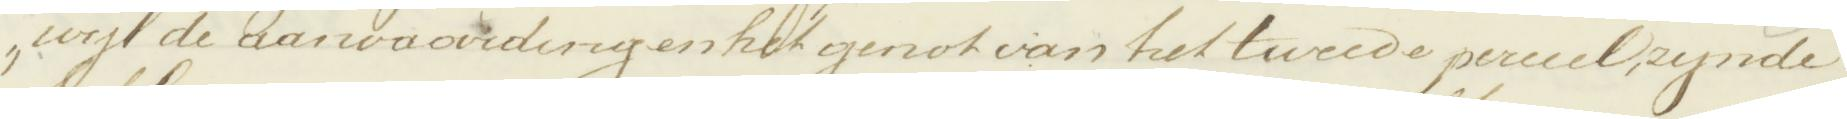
„wyl de aanvaarding en het genot van het tweede perceel, zynde
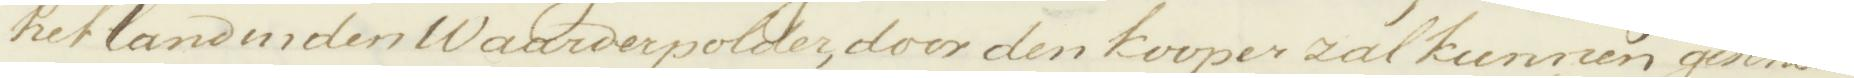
het land in den Waarderpolder, door den kooper zal kunnen geschie.
